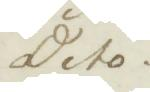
Dito . . . . . . . . .
